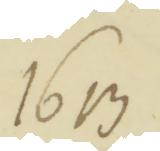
1613
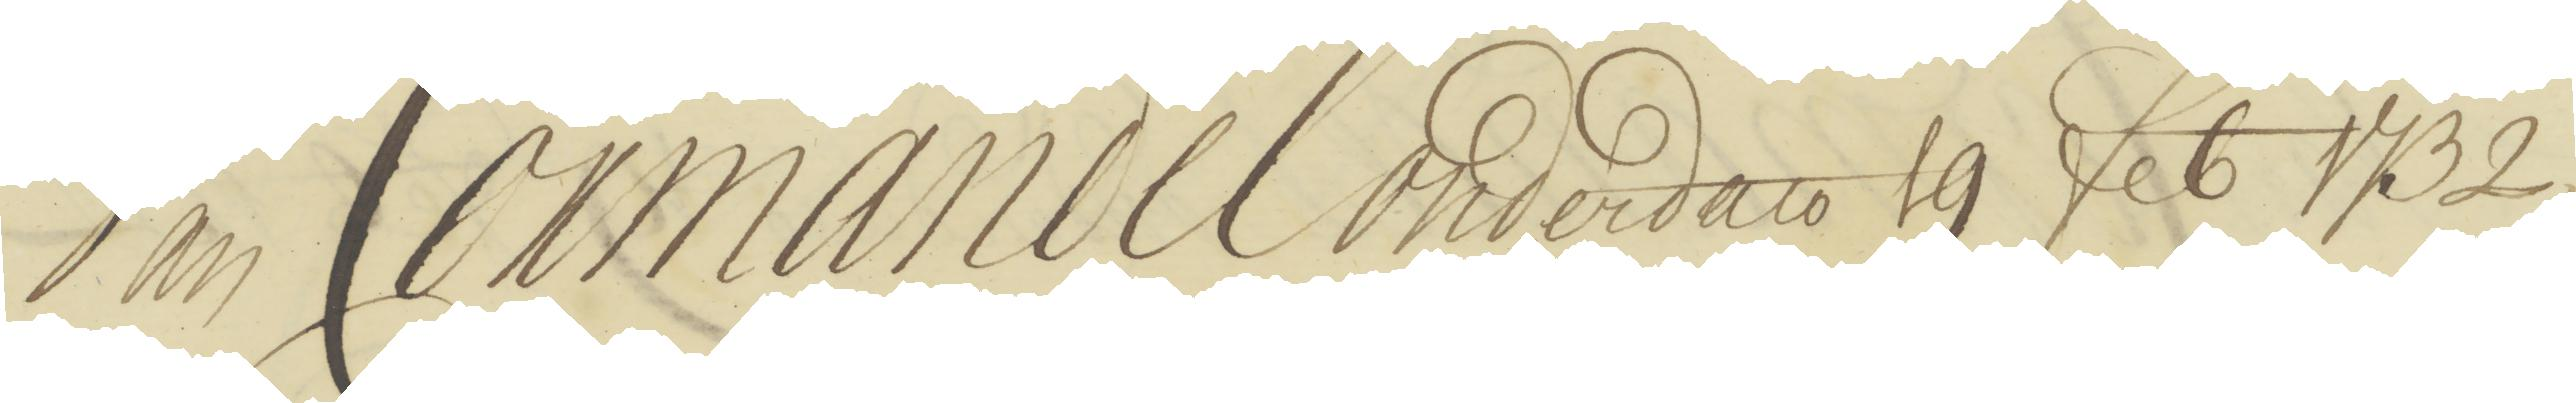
Van Cormandel onderdato 19 feb 1732
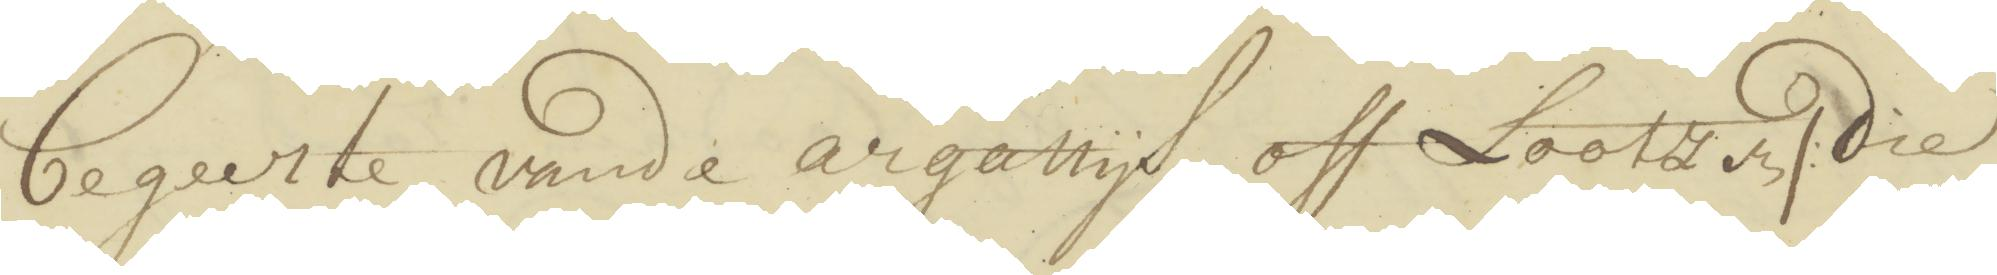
begeerte vande argatijs off Lootzen /:die
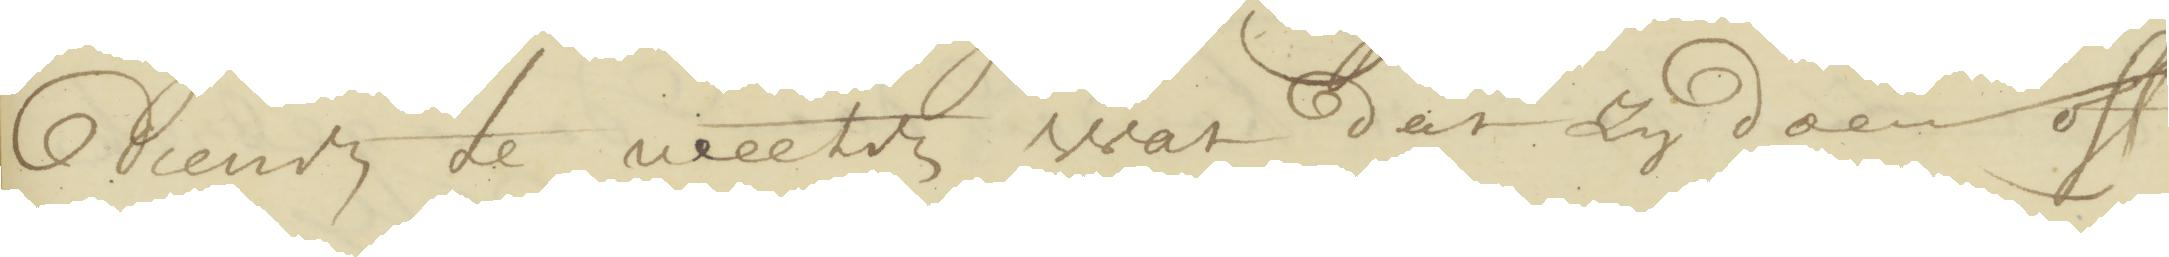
dienen te weeten wat dat zij doen off
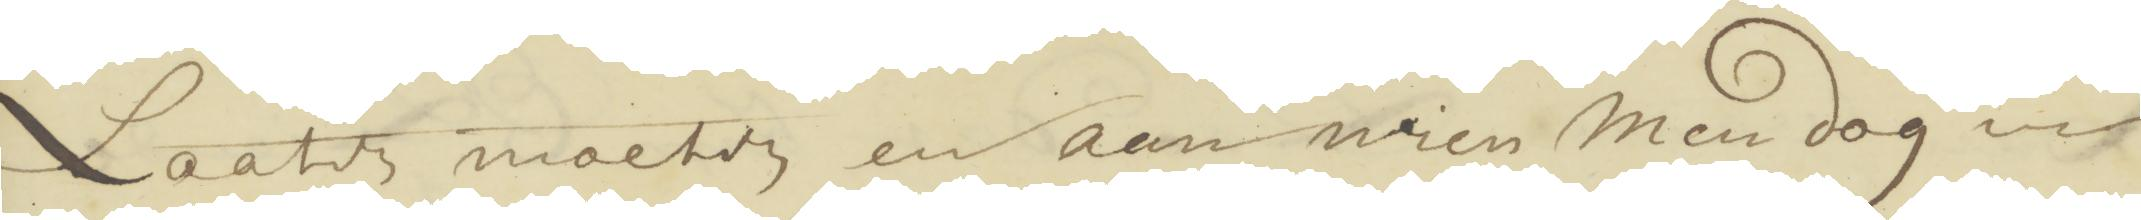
Laaten moeten en aan wien men dog in
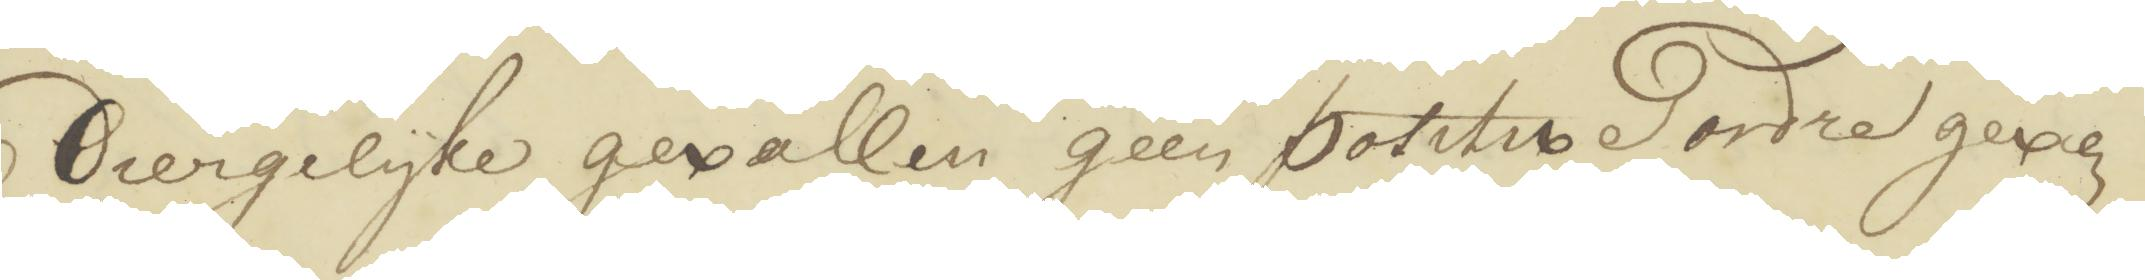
diergelijke gevallen geen positive ordre geven
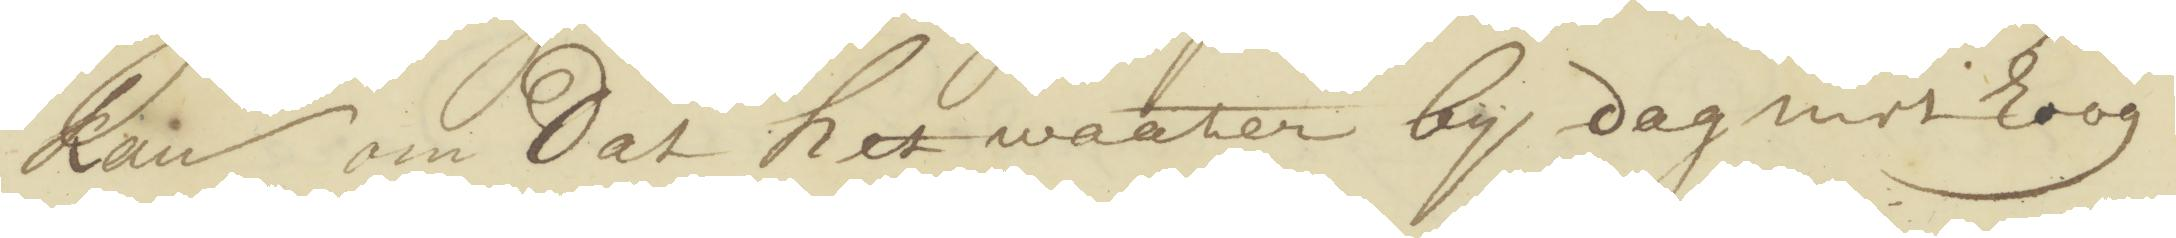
kan om dat het waater bij dag niet hoog
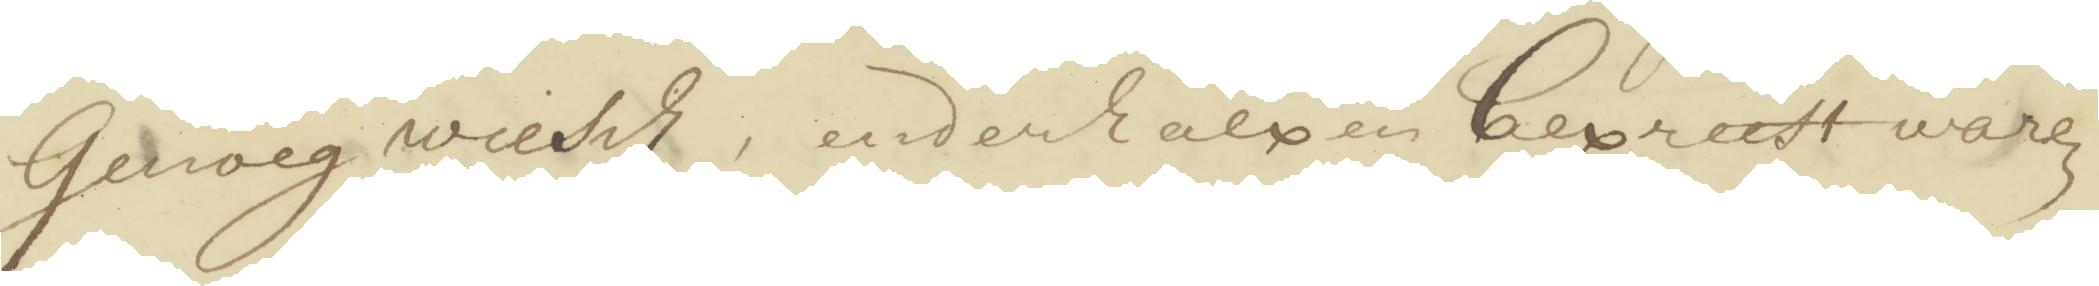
genoeg wiesch, en derhalven bevreest waren
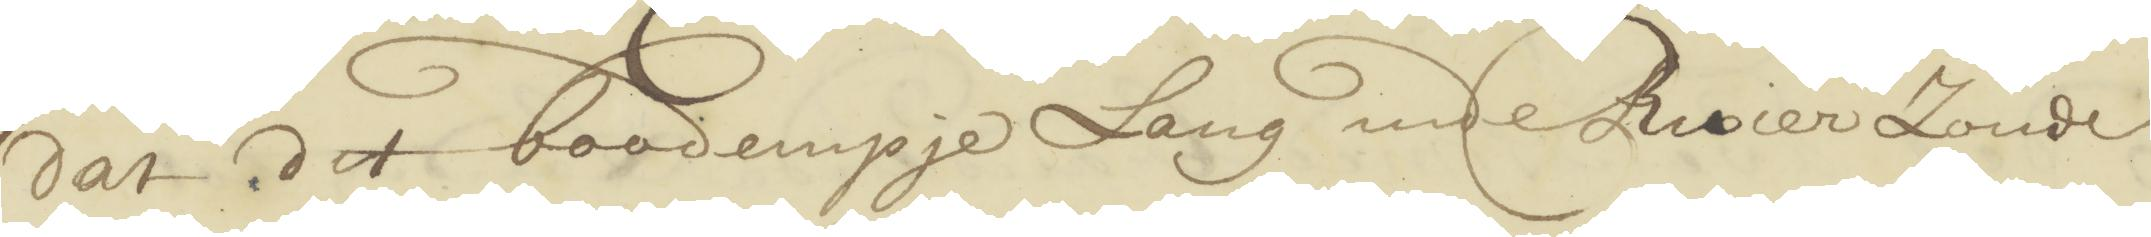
dat dit boodempje Lang in de Rivier zoude
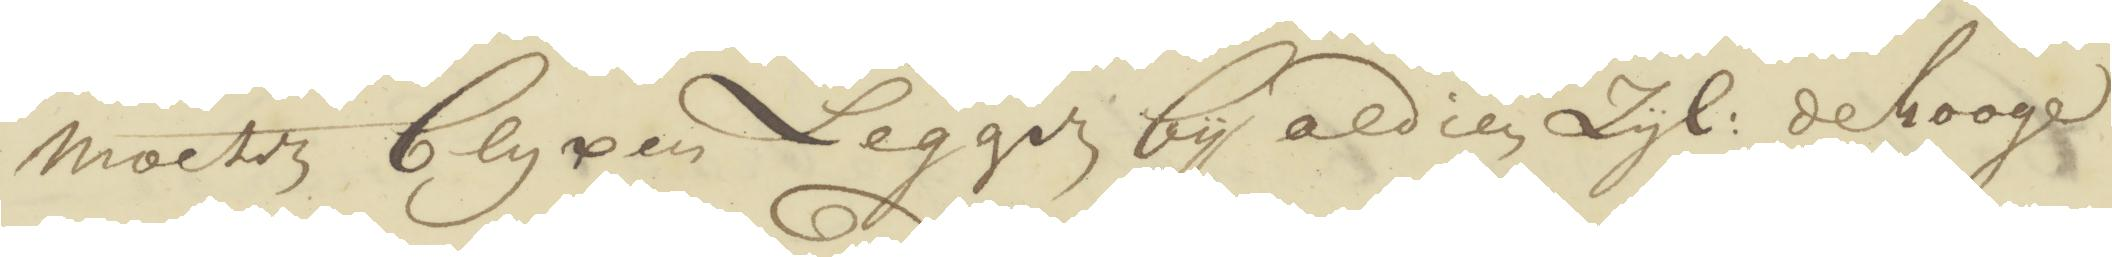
moeten blyven Leggen bij aldien zijl: de hooge
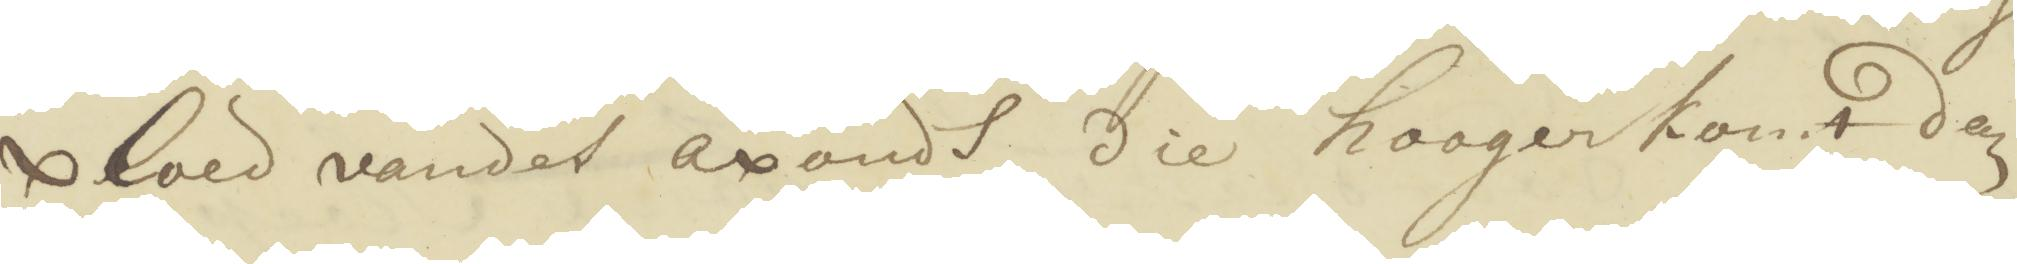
vloed van des avonds die hooger komt dan
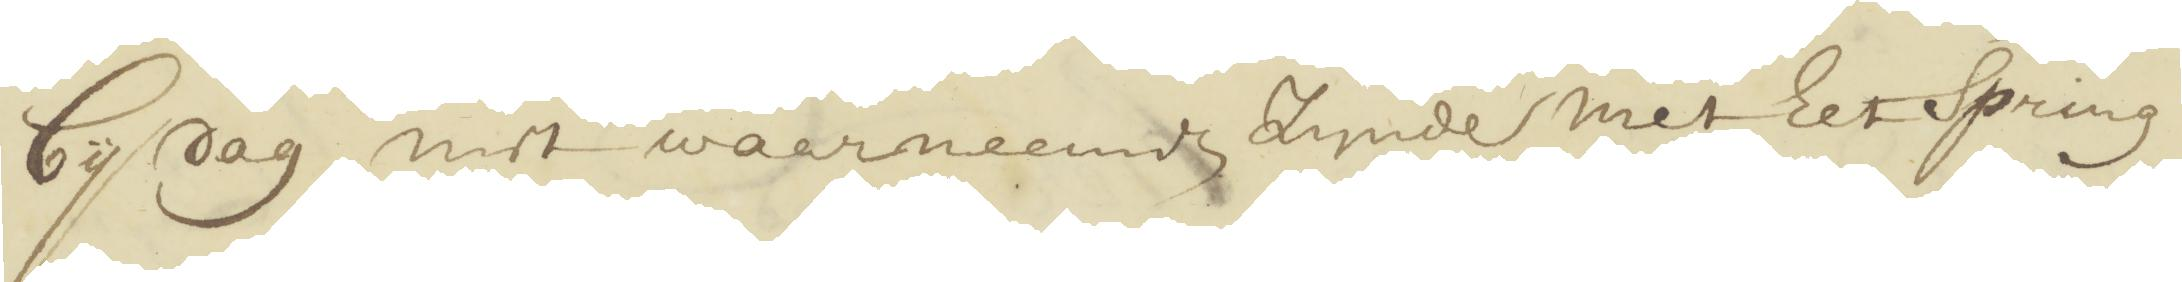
bij dag met waarneemen zynde met het spring
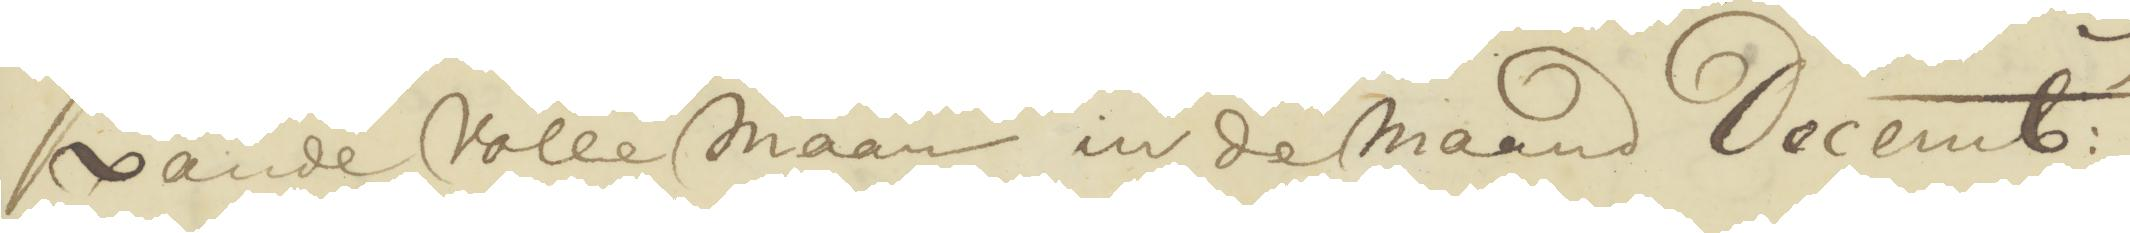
van de volle maan in de maand Decemb:r
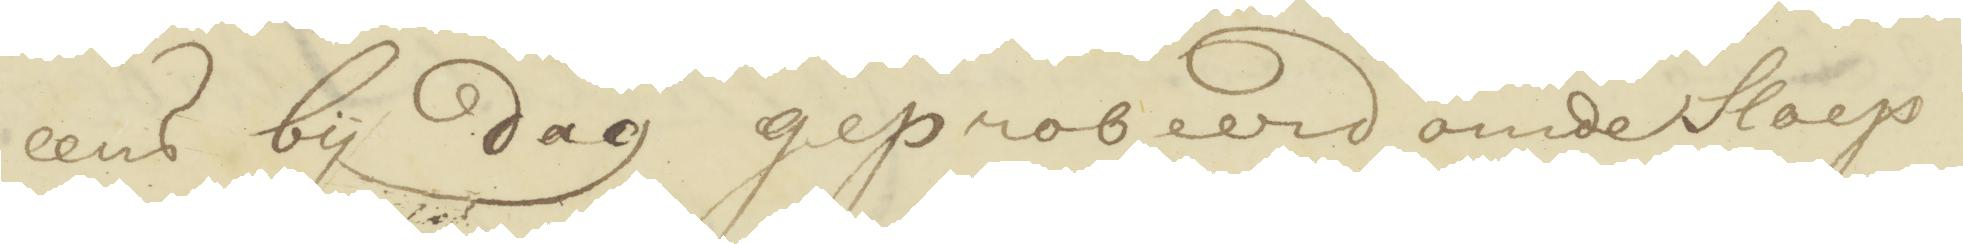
eens bij dag geprobeerd om de sloep
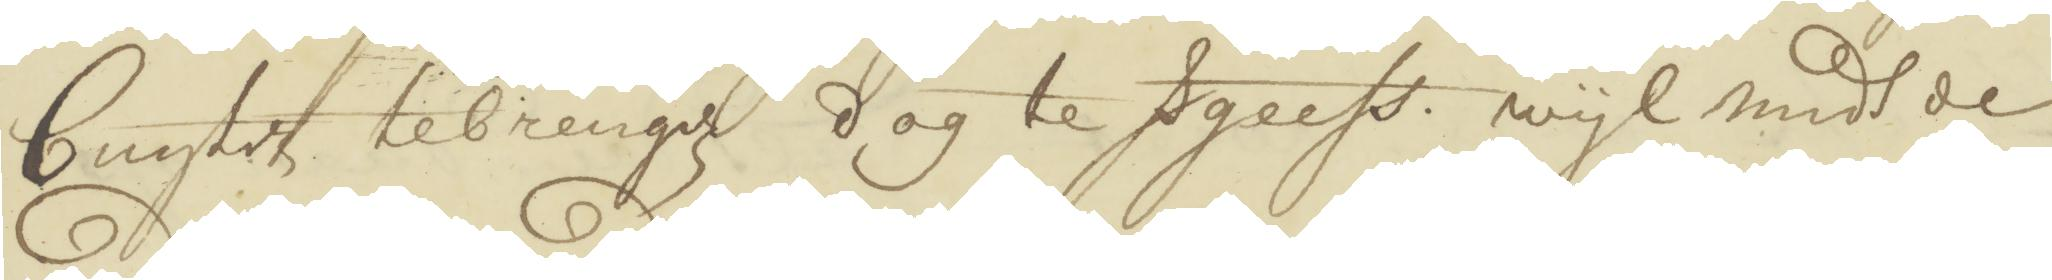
buyten te brengen dog te vergeefs. wijl mids de
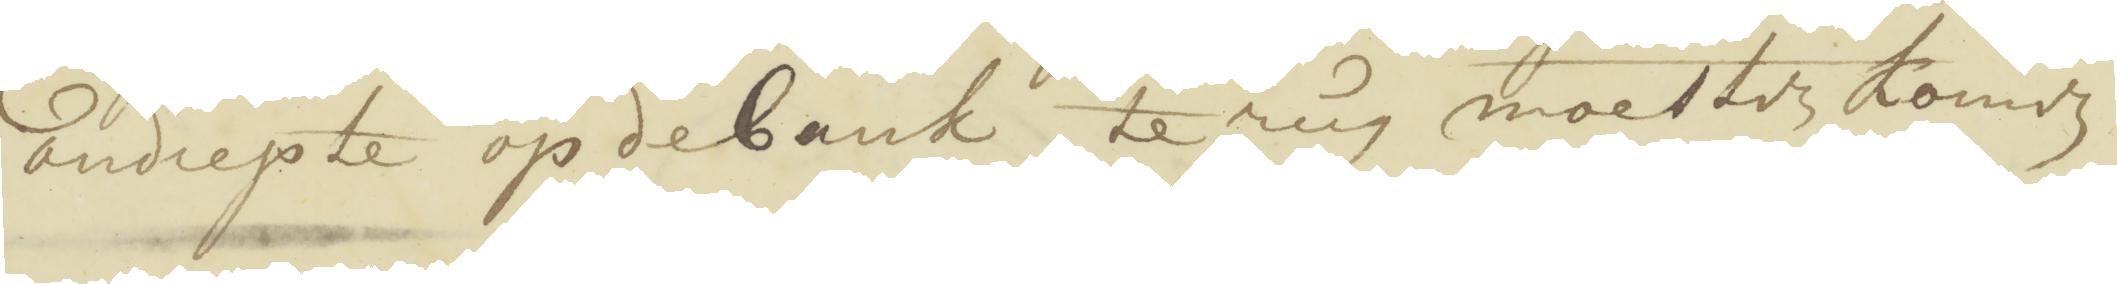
ondiepte op de bank te rug moetten komen
